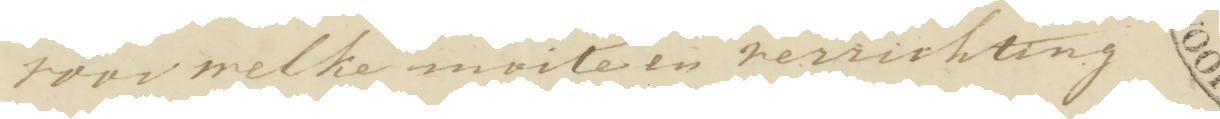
voor welke moite en verrichting
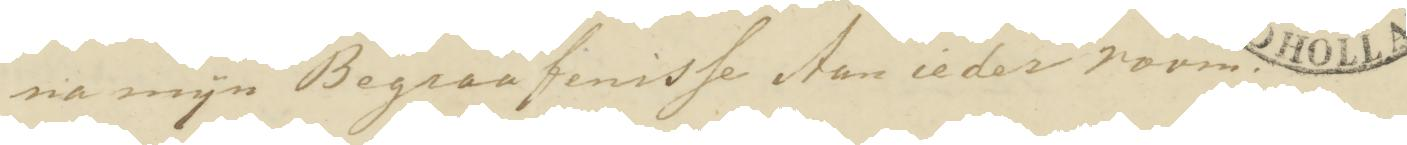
na mijn Begraafenisse Aan ieder voorn:
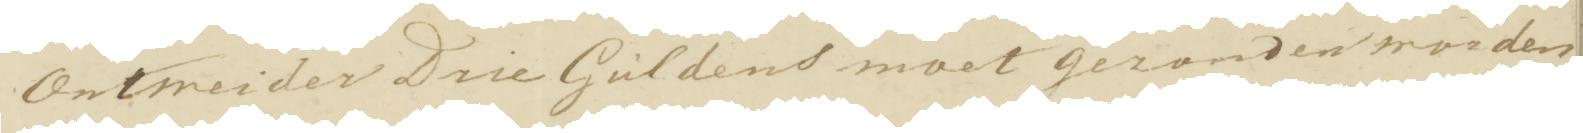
Ontweider Drie Guldens moet gezonden worden
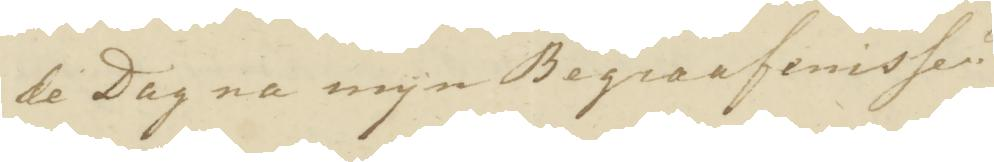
de Dag na mijn Begraafenisse
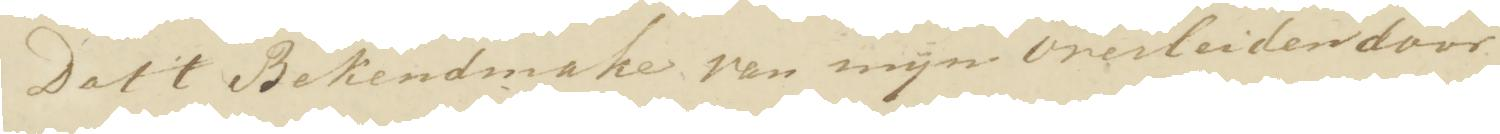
Dat ’t Bekendmake van mijn overleiden door
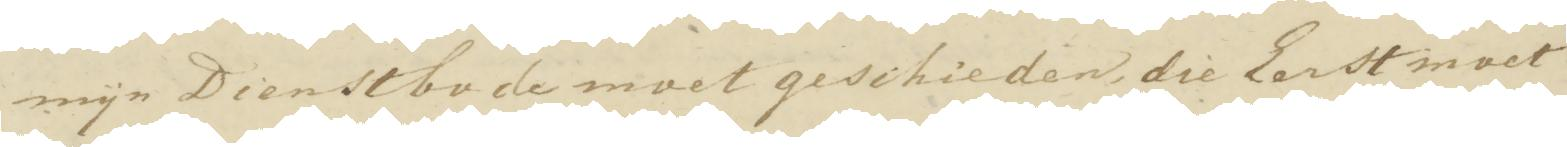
mijn Dienstbode moet geschieden, die Eerst moet
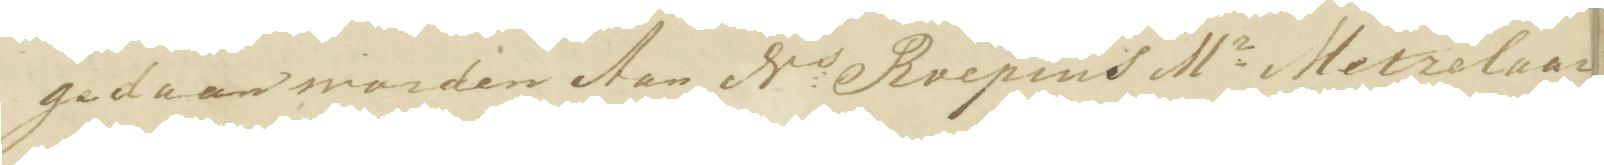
gedaan worden Aan N:s Roepius M:r Metzelaar
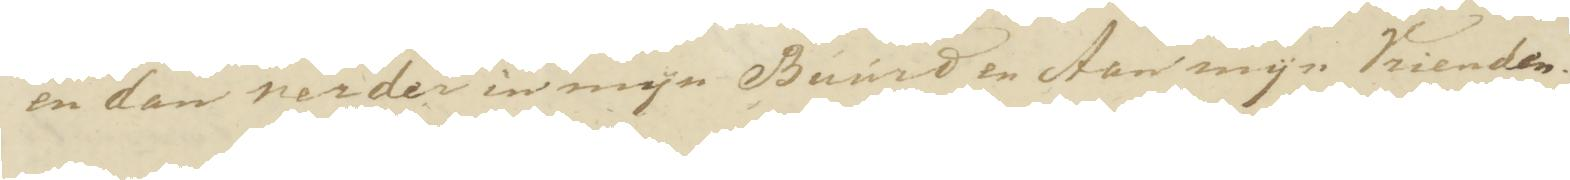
en dan verder in mijn Buurd en Aan mijn Vrienden.
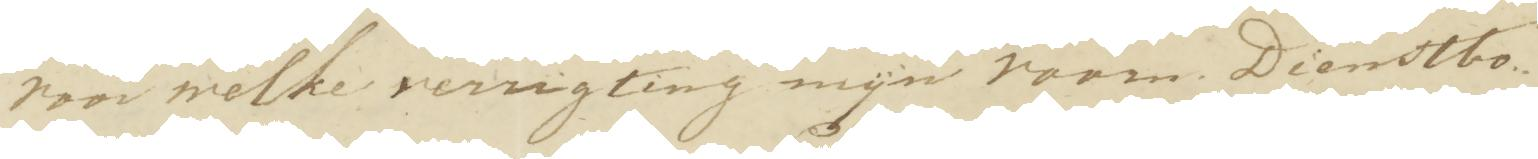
voor welke verrigting mijn voorn. Dienstbo„
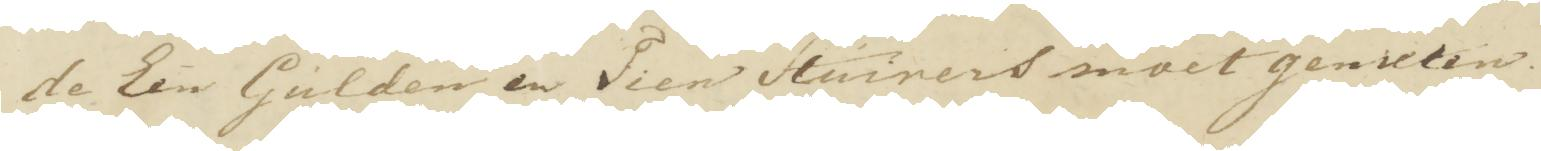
de Een Gulden en Tien stuivers moet genieten.
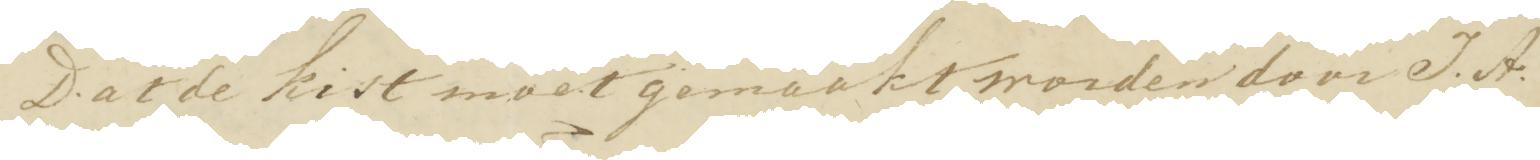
Dat de kist moet gemaakt worden door I. A.
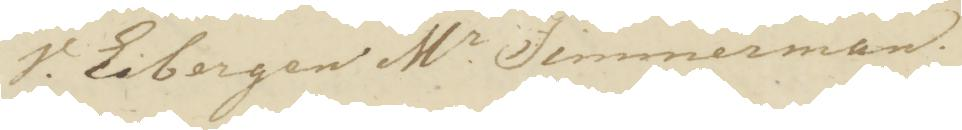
V. Eibergen M.r Timmerman.
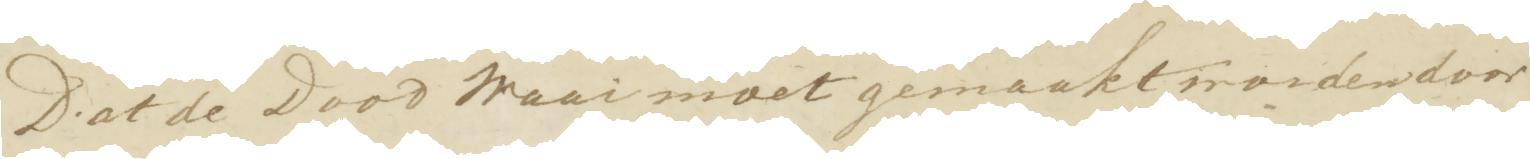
Dat de Dood Waai moet gemaakt worden door
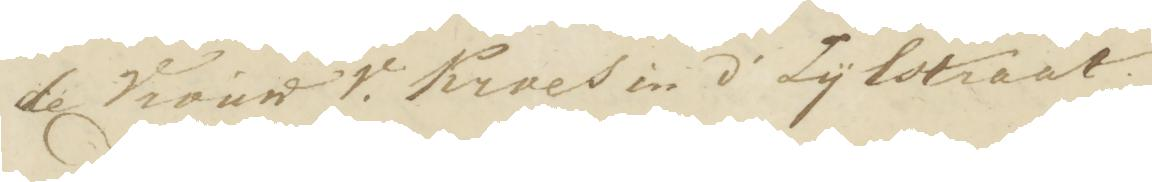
de Vrouw V. Kroes in d’ Zijlstraat.
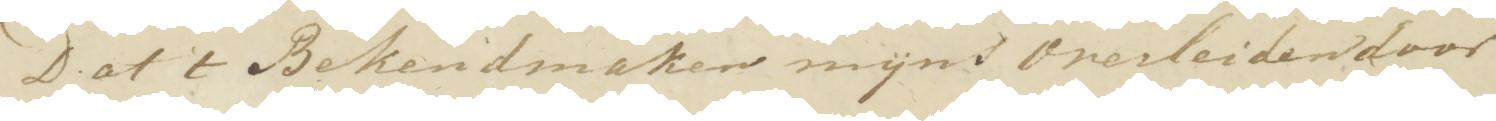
Dat ’t Bekendmaken mijns overleiden door
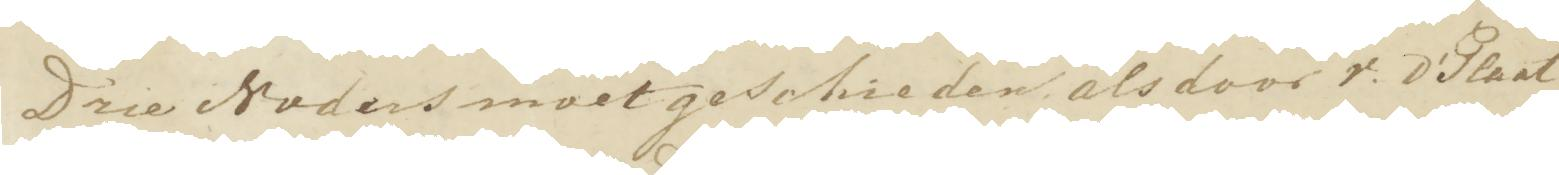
Drie Noders moet geschieden, als door v. d' Plaat
